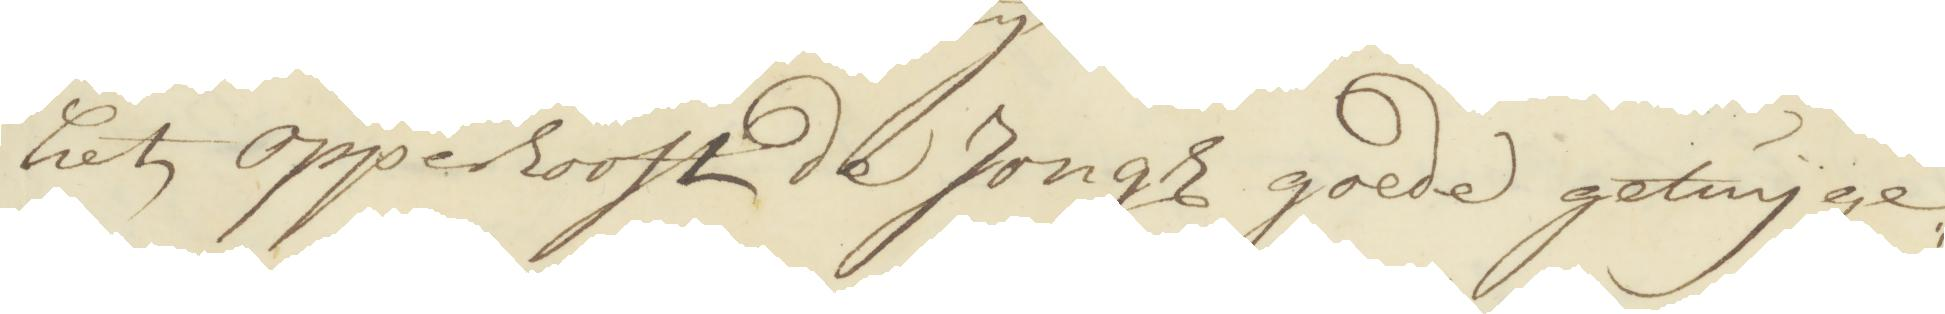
het opperhooft de Jongh goede getuijge„
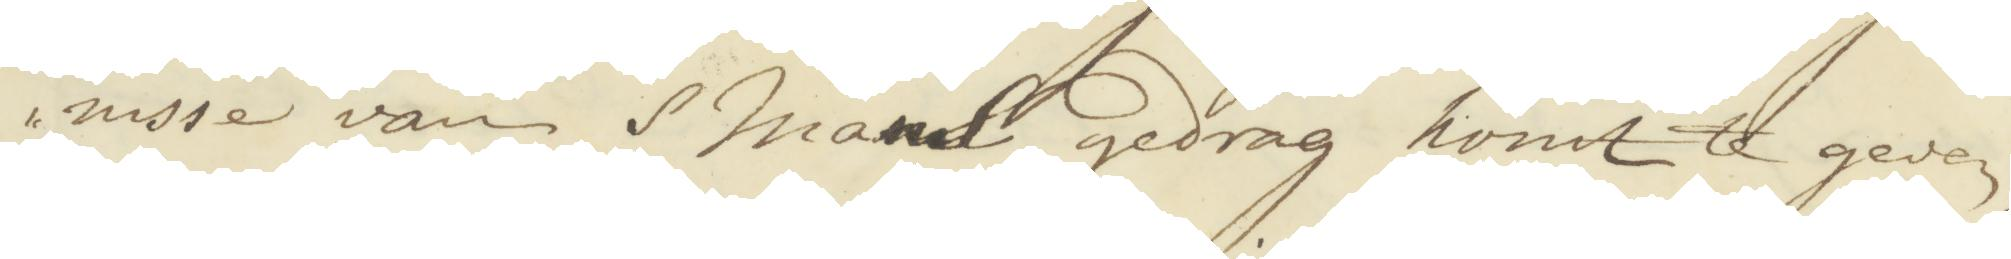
„nisse van 's mans gedrag komt te geven,
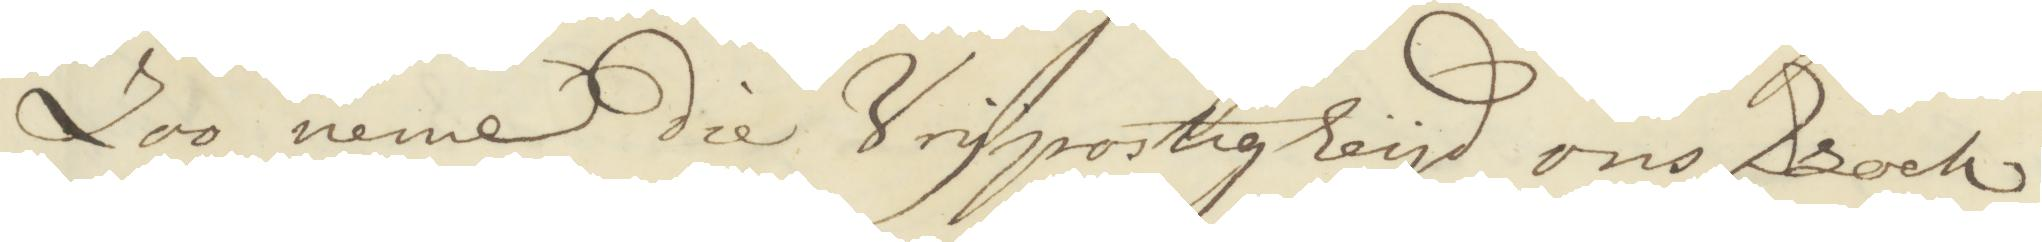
zoo neme die Vrijpostigheijd ons verzoeck,
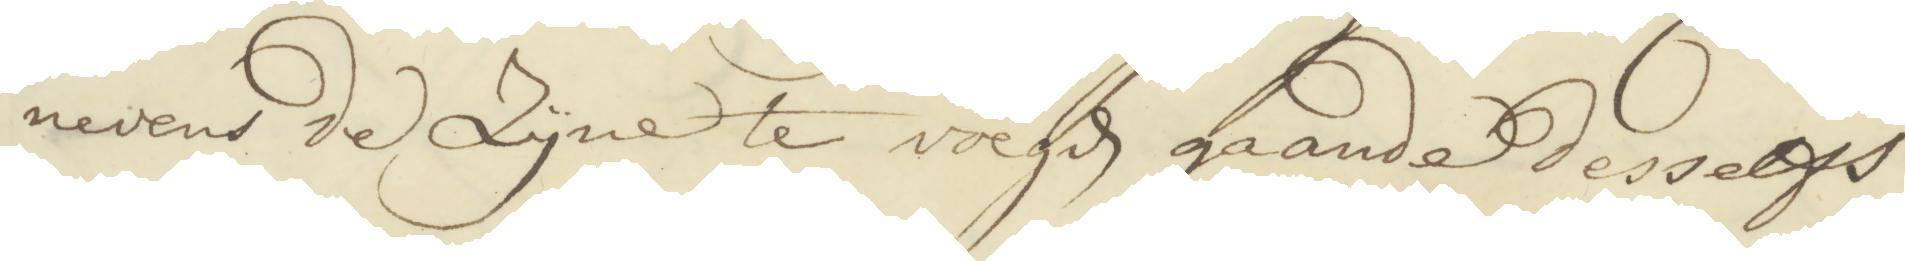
nevens de zijne te voegen gaande desselfs
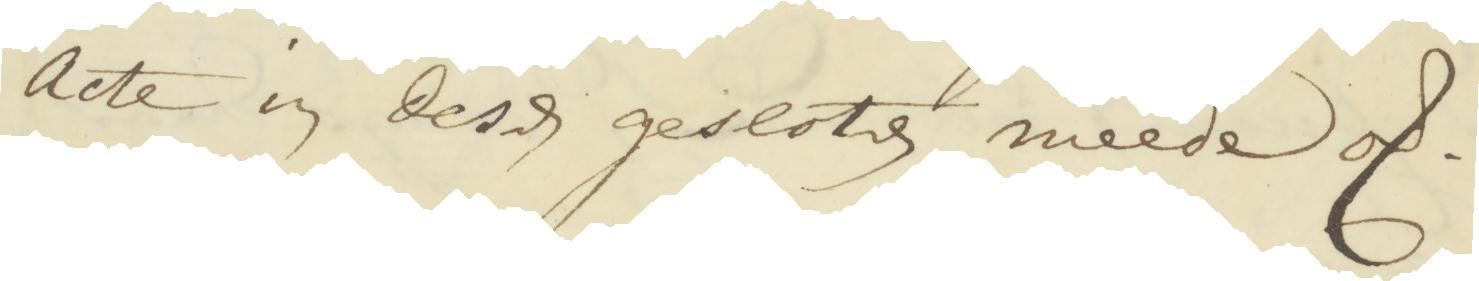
acte in desen gesloten meede over.
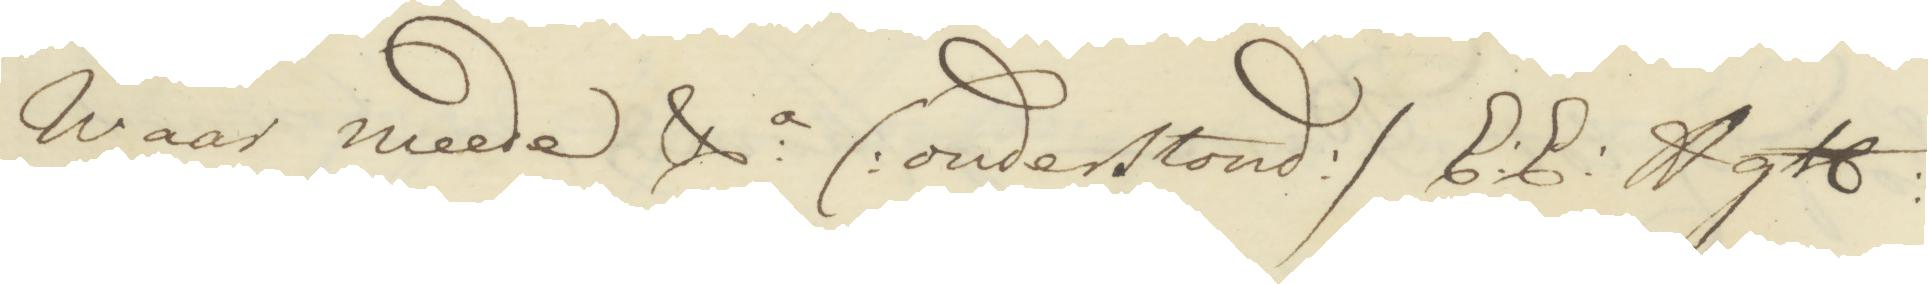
waar meede &:a (:onderstond:/ E: E: Agtb:
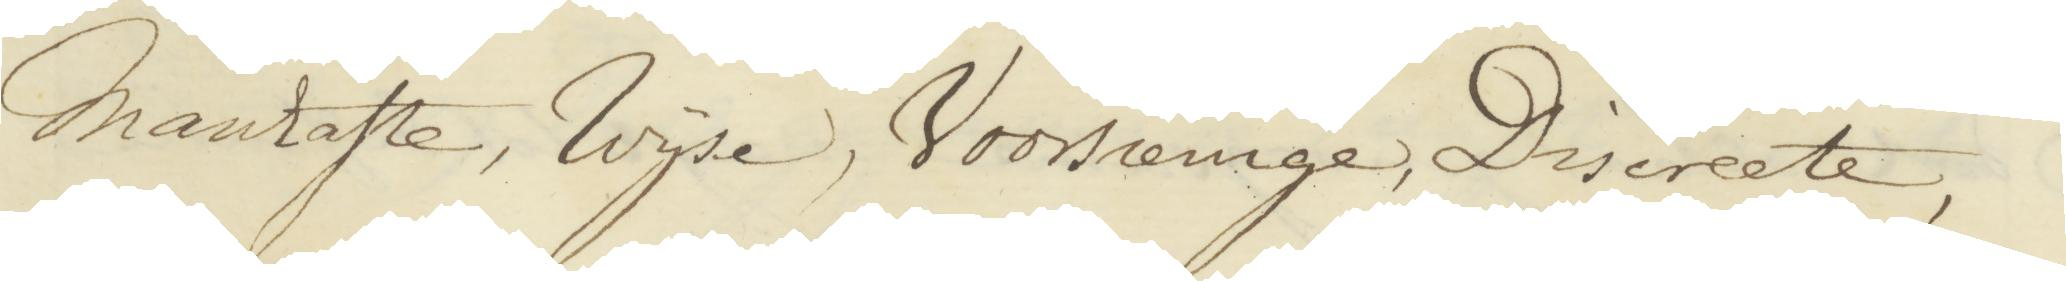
Manhafte, Wijse, Voorsienige, Discreete,
